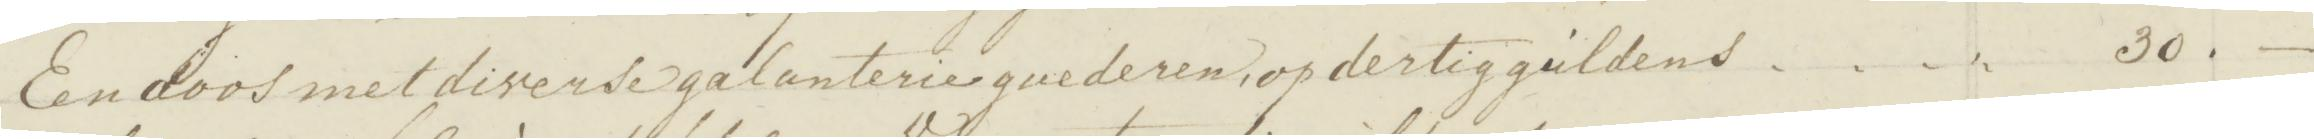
Een doos met diverse galanterie goederen, op dertig guldens - - - „ 30 . —
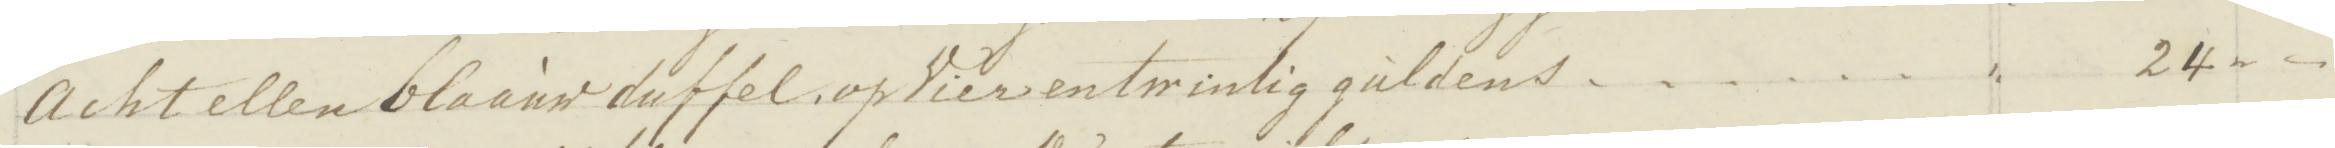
Acht ellen blaauw duffel, op Vier entwintig guldens - - - - - - „ 24„ —
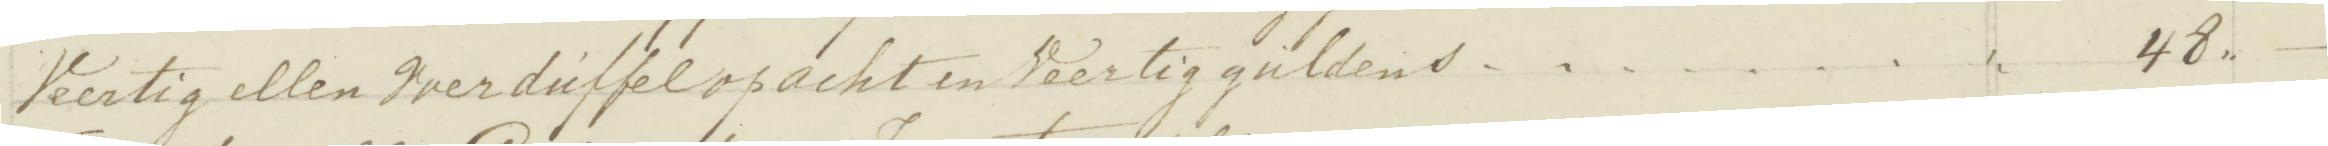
Veertig ellen Voerduffel op acht en Veertig guldens - - - - - - - „ 48„ —
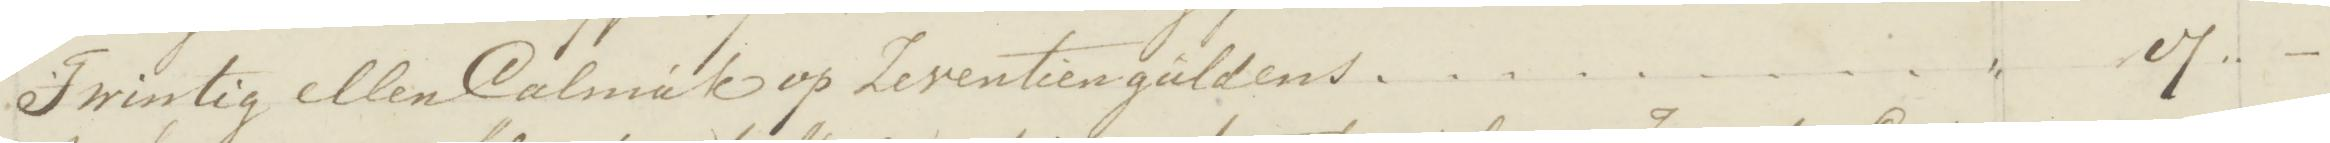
Twintig ellen Calmuk op Zeventien guldens - - - - - - - - - - „ 17„ —
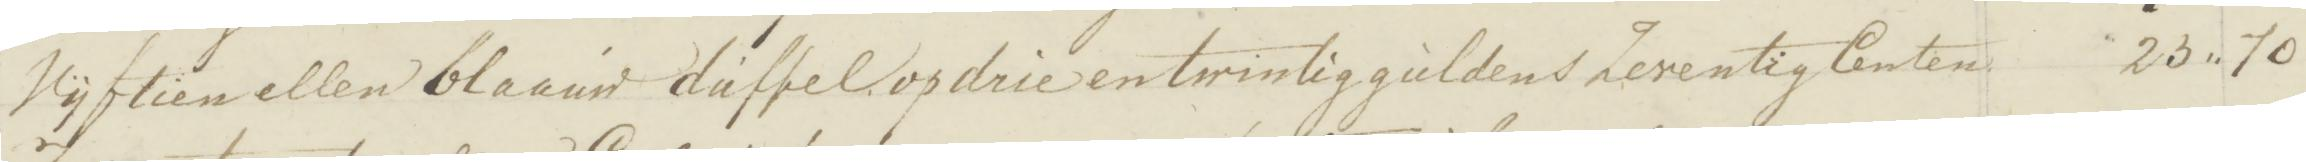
Vijftien ellen blaauw duffel op drie en twintig guldens Zeventig Centen 23„70
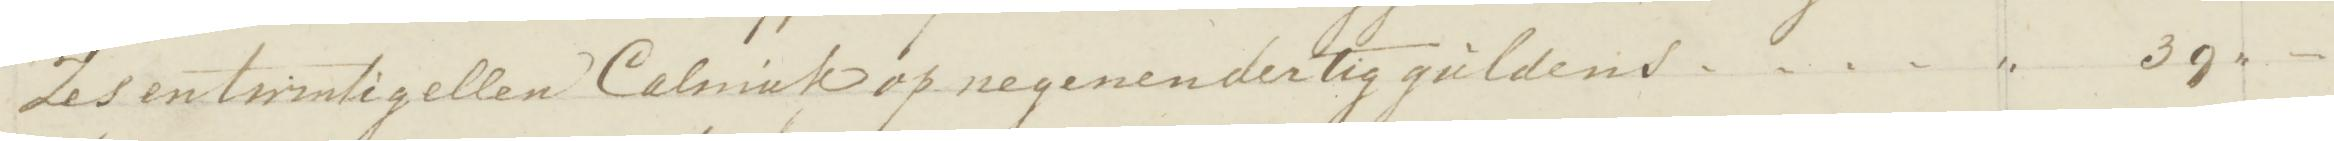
Zes en twintig ellen Calmuk op negenendertig guldens - - - - „ 39„ —
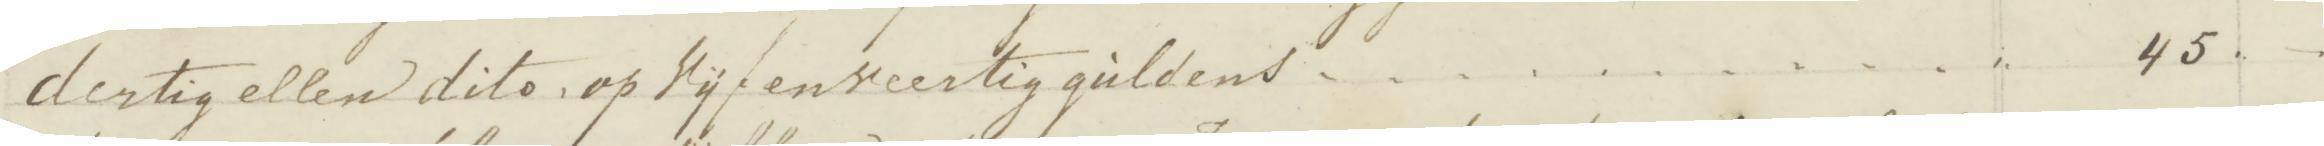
dertig ellen dito, op Vijf enveertig guldens - - - - - - - - - - „ 45 „ —
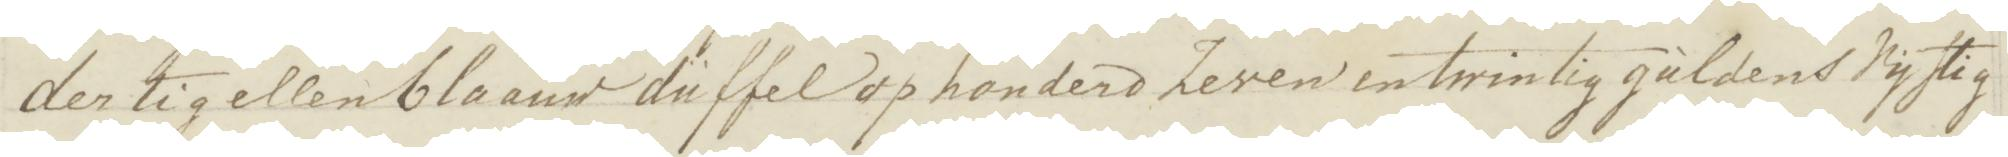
dertig ellen blaauw duffel op honderd Zeven en twintig guldens Vijftig
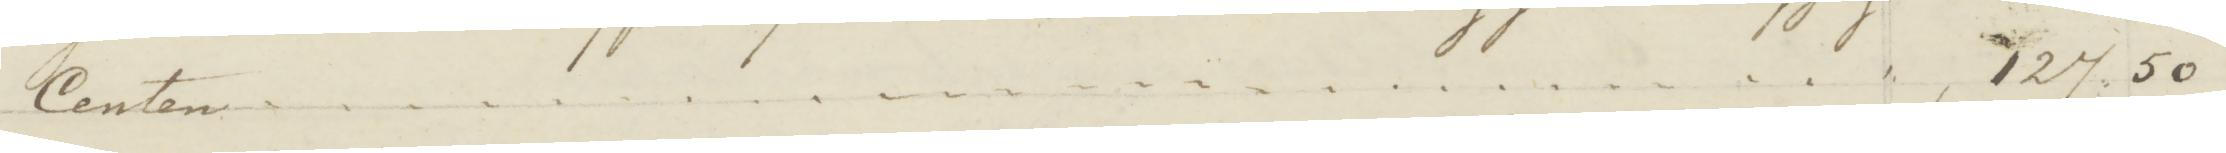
Centen - - - - - - - - - - - - - - - - - - - - - - - - - - - „ 127„50
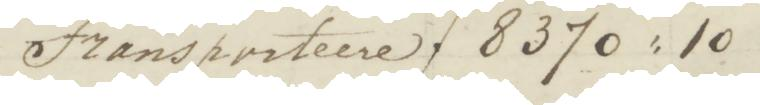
Transporteere ƒ 8370 „ 10
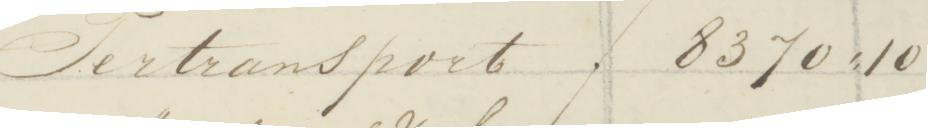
Pertransport ƒ 8370 „10
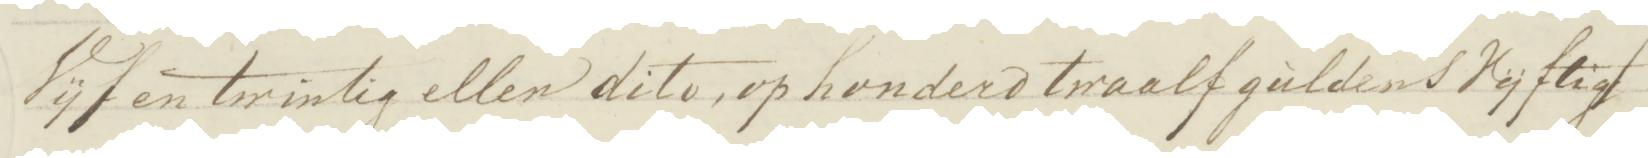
Vijf en twintig ellen dito, op honderd twaalf guldens Vijftig
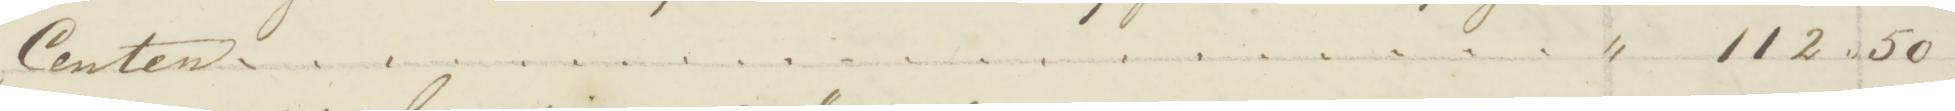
Centen - - - - - - - - - - - - - - - - - - - - - „ 112 „50
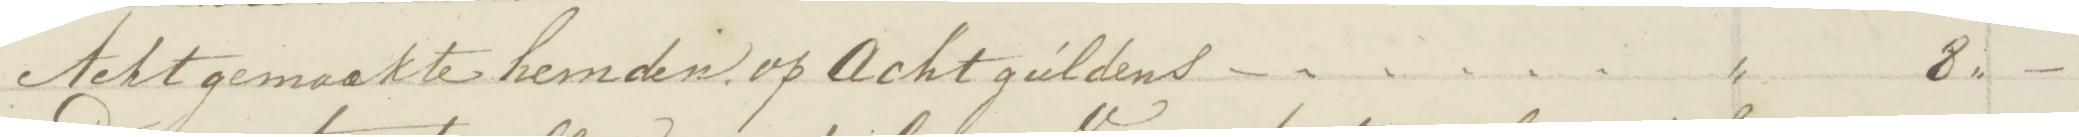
Acht gemaakte hemden op Acht guldens - - - - - - „ 8„ —
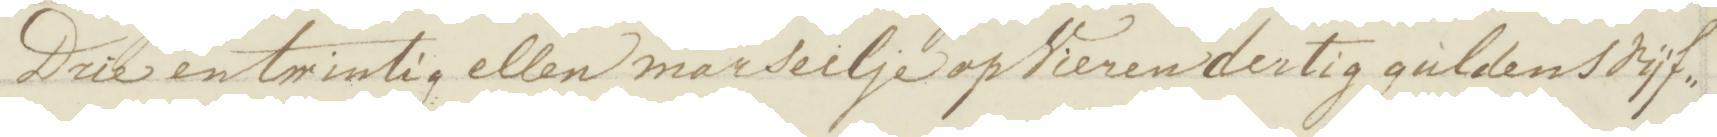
Drie en twintig ellen marseilje op Vierendertig guldens Vijf„
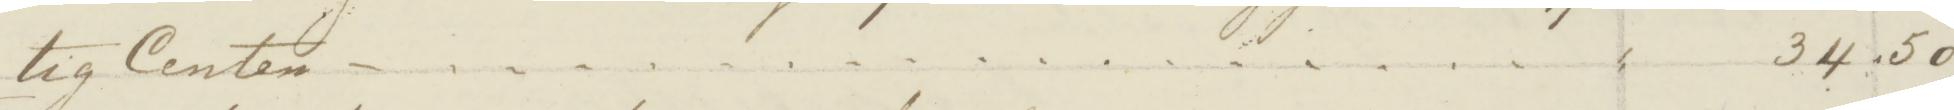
tig Centen - - - - - - - - - - - - - - - - - „ 34 „50
